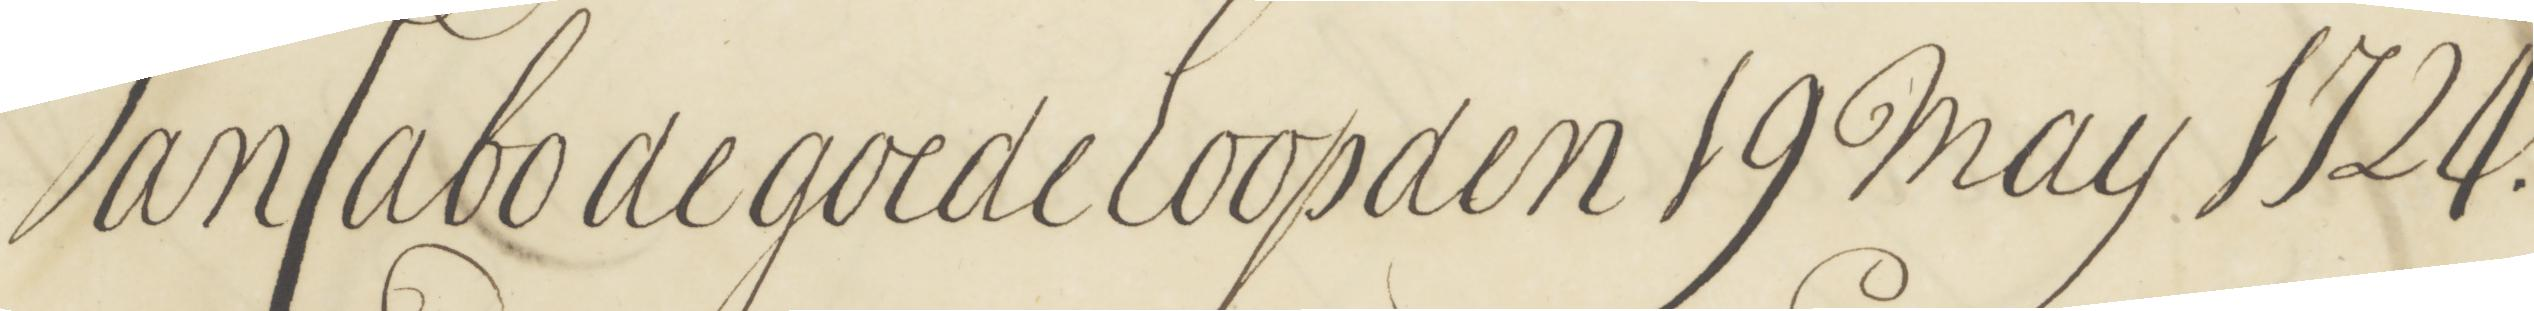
Van Cabo de goede hoop den 19 may 1724.
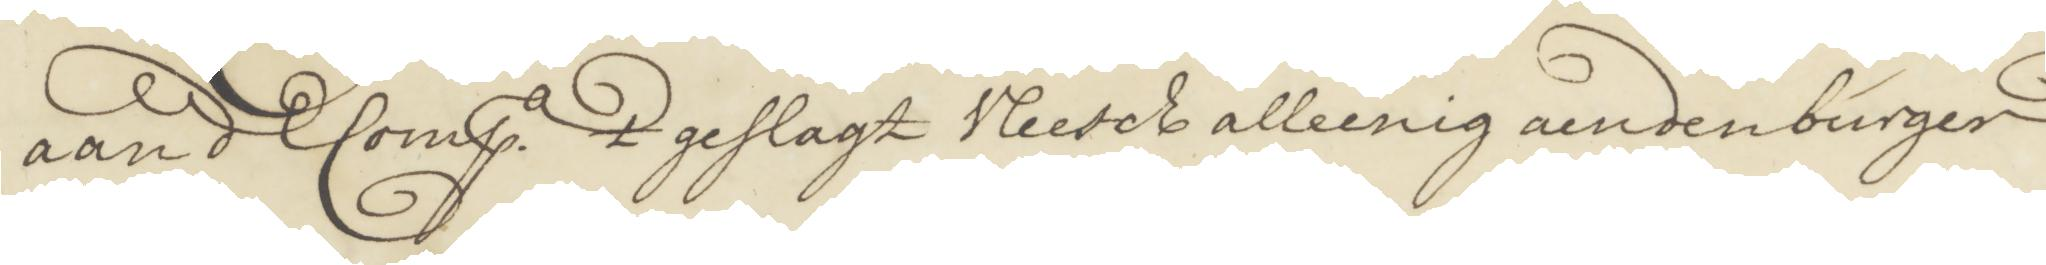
aan d EComp.e 't geslagt vleesch alleenig aen den burger
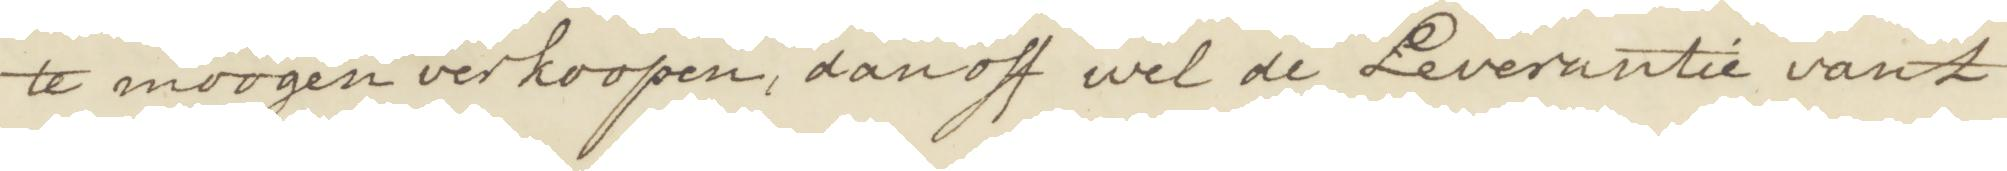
te moogen verkoopen, aan off wel de Leverantie van’t
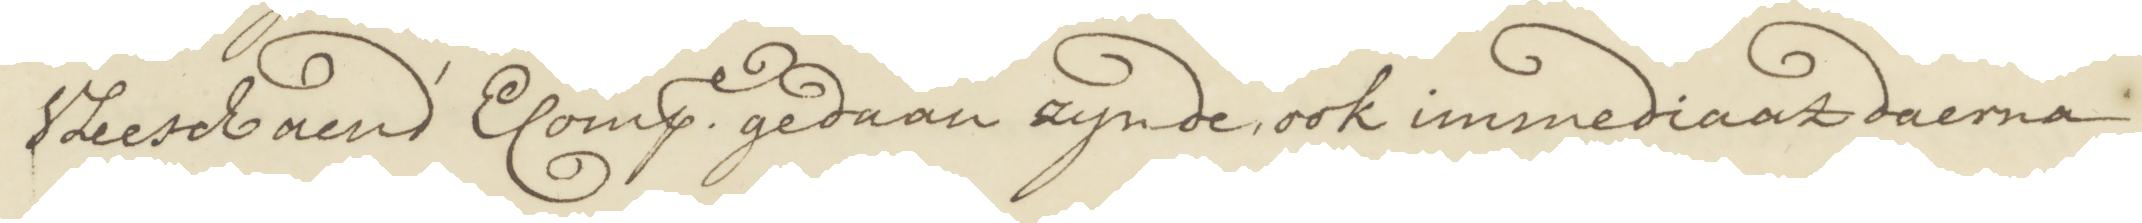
vleesch aend' EComp.e gedaan zynde ook immediaat daerna
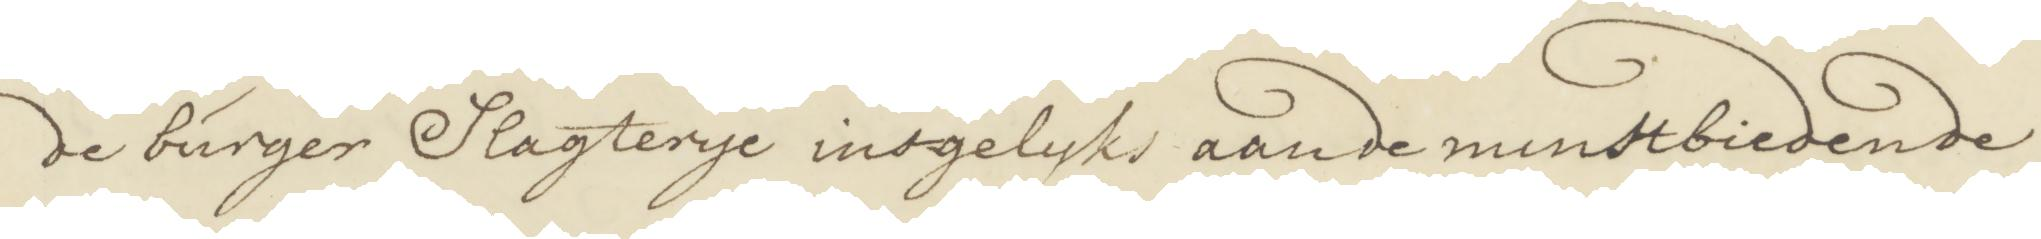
de burger Slagterye insgelyks aan de minstbiedende
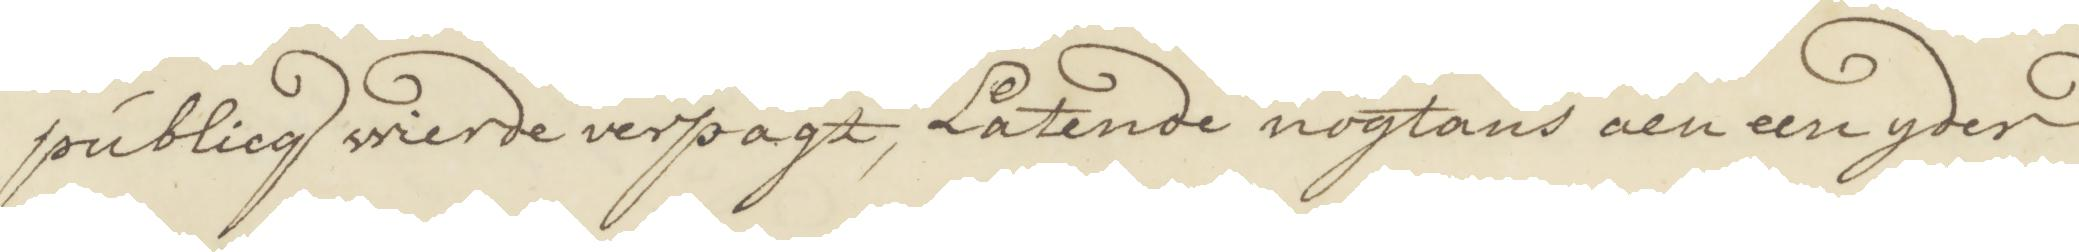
publicq wierde verpagt, Latende nogtans aen een yder
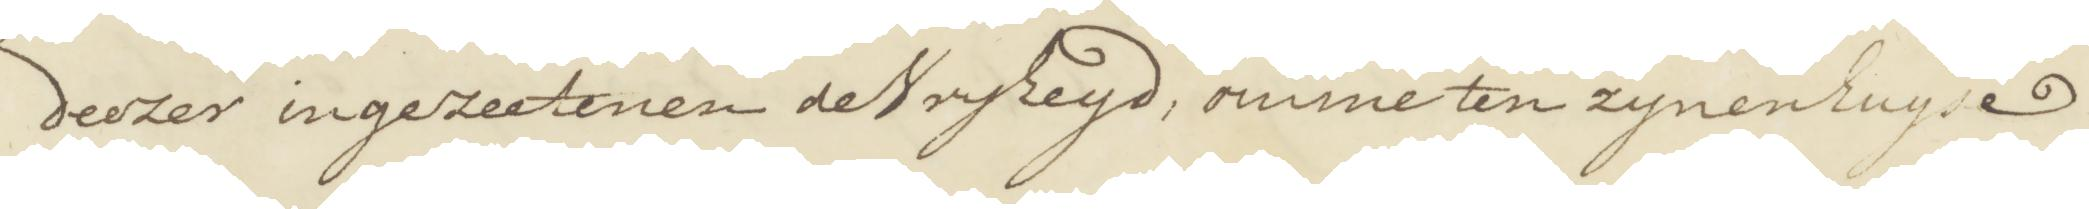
deezer ingezeetenen de vryheyd, omme ten zynen huyse
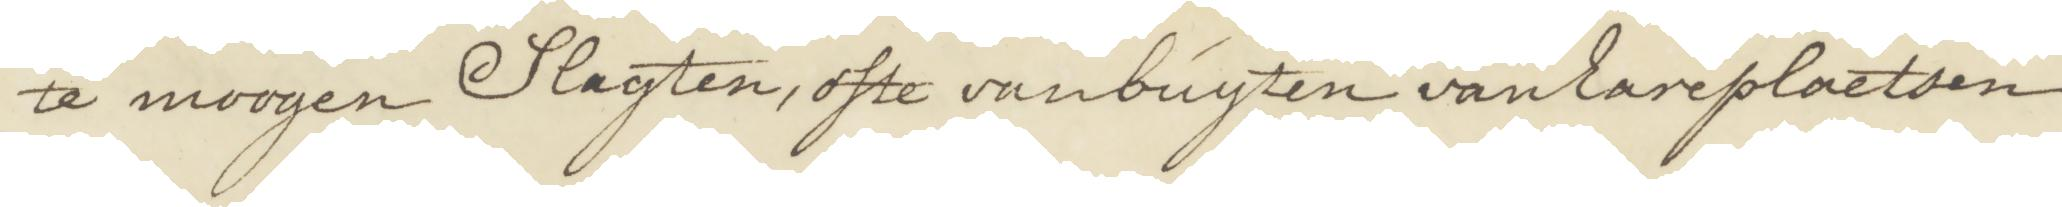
te moogen Slagten, ofte van buyten van hareplaetsen
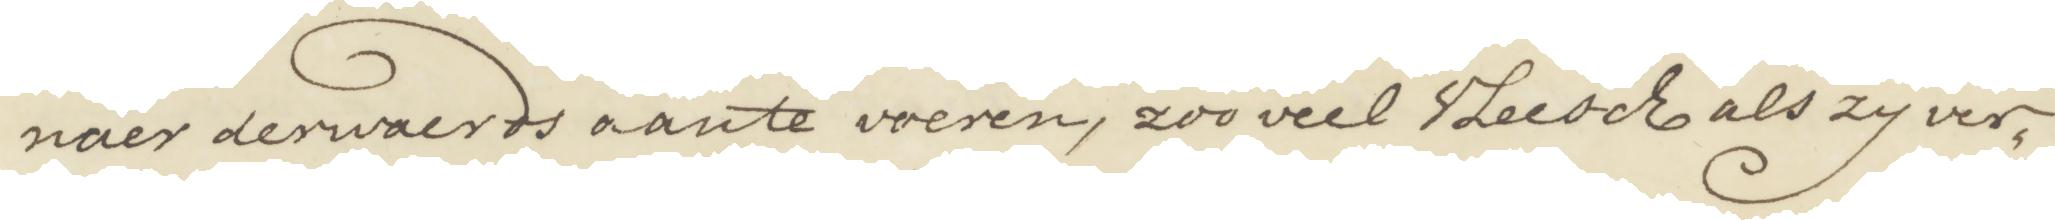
naer derwaerds aante voeren, zoo veel vleesch als zy ver„
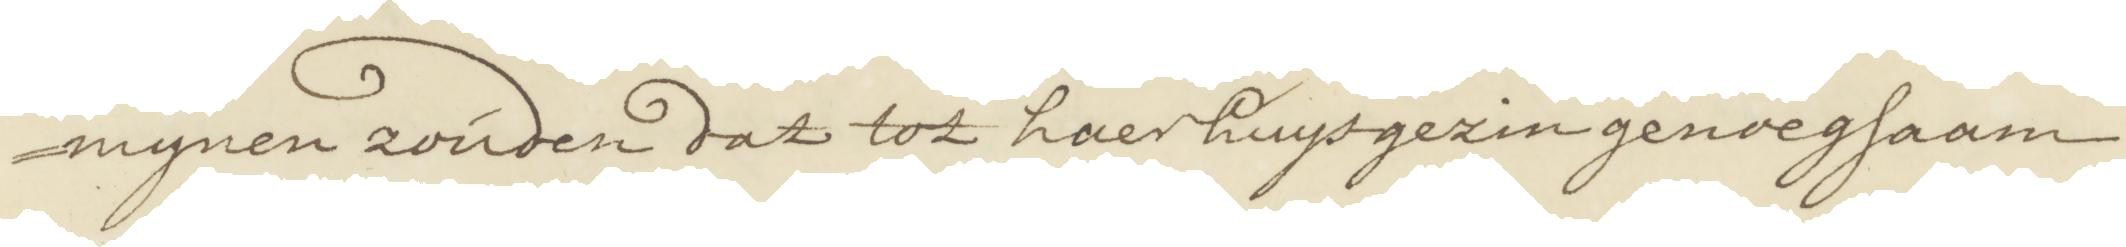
=mynen zouden dat tot haer huysgezin genoegsaam
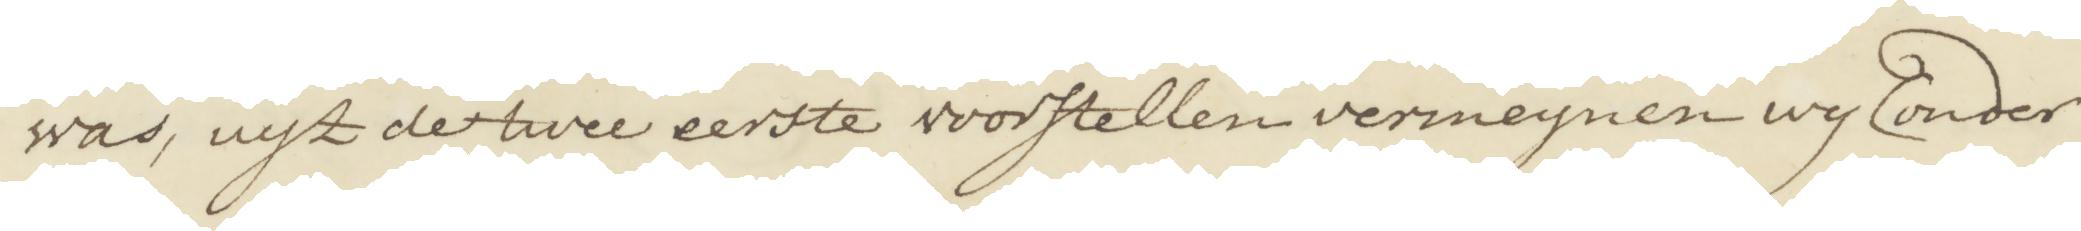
was, uyt de twee eerste voorstellen vermeynen wy (onder
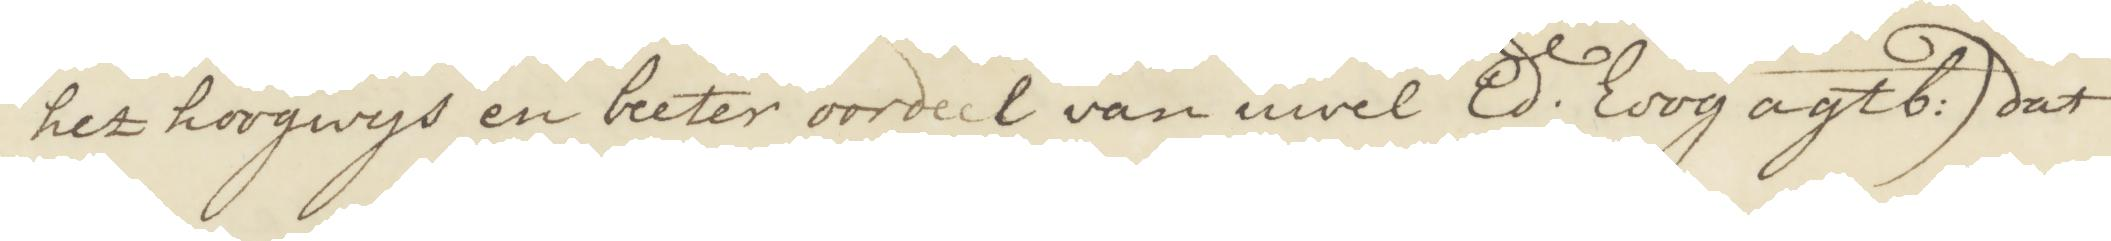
het hoogwys en beeter oordeel van uwel Ed.e hoog agtb:) dat
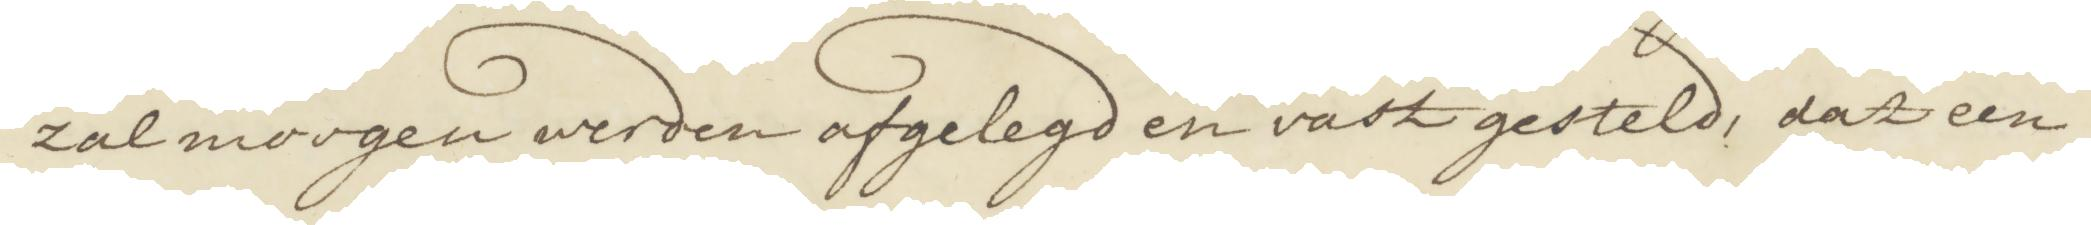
zal moogen werden afgelegd en vast gesteld, dat een
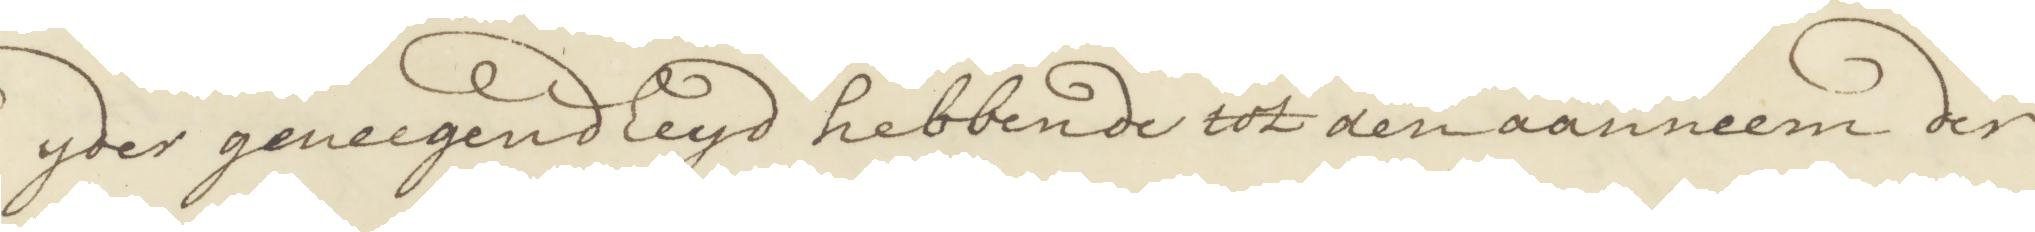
yder geneegendheyd hebbende tot den aanneem der
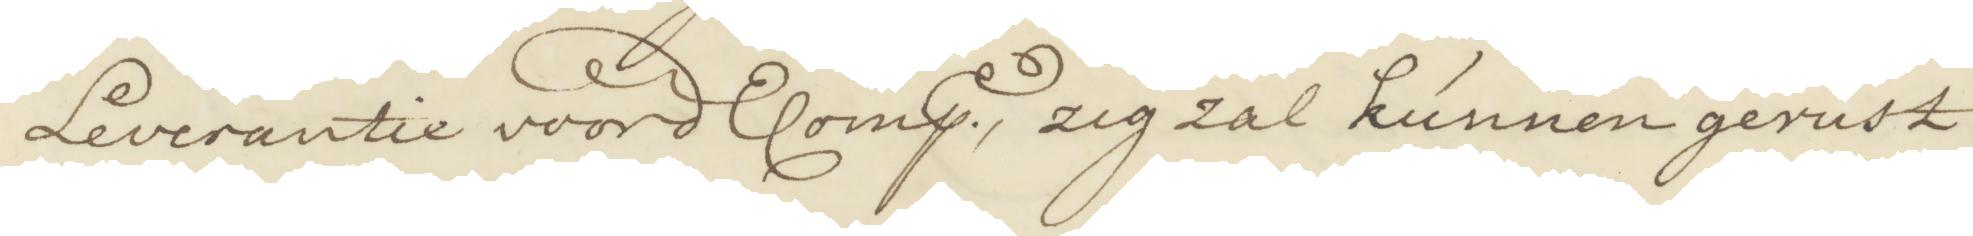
Leverantie voor dEComp.e, zig zal kunnen gerust
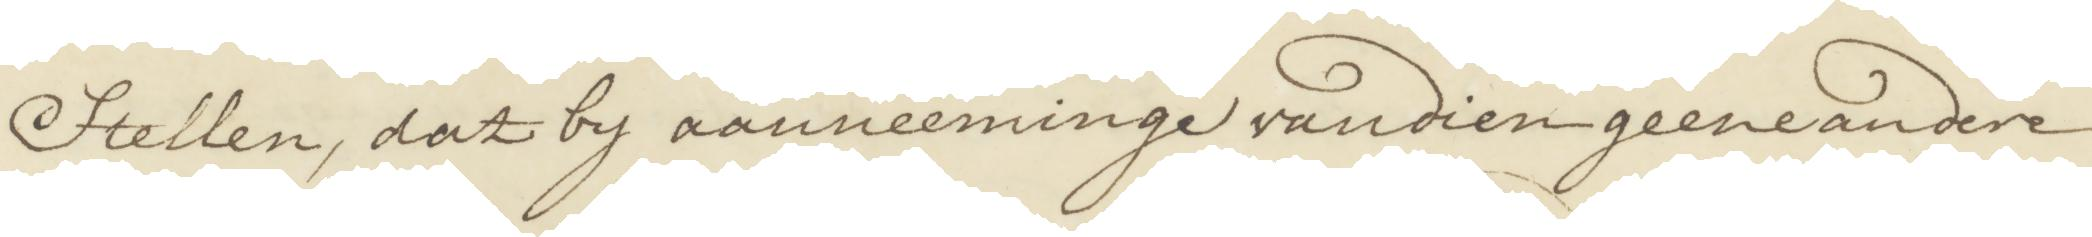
Stellen, dat bij aanneeminge vandien geene andere
